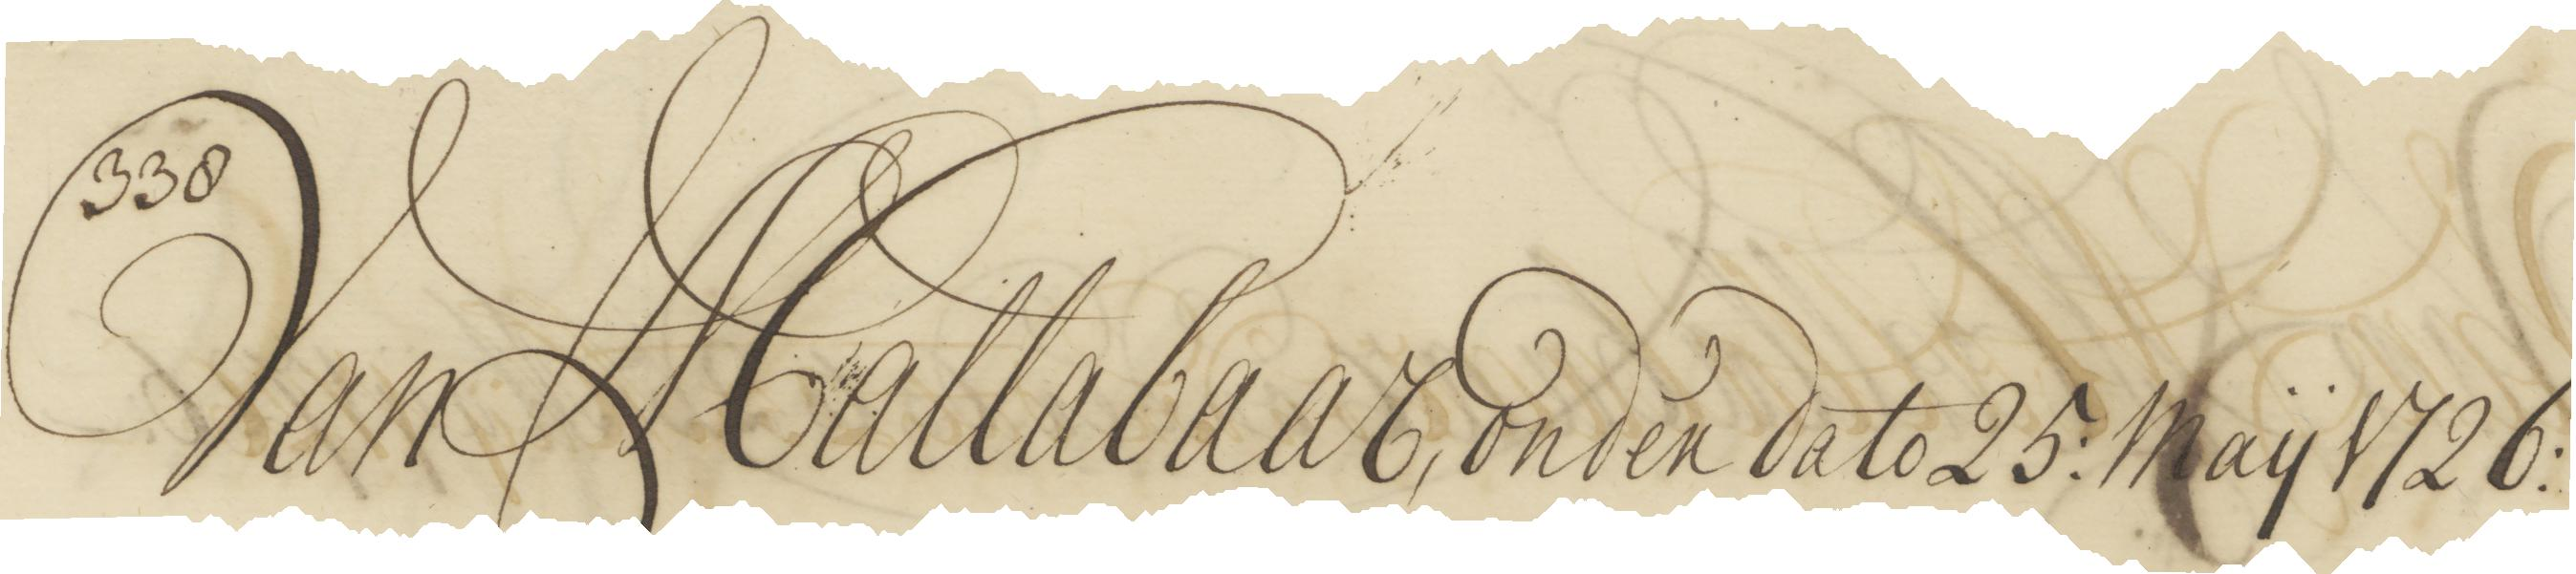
Van Mallabaar, onder dato 25: Maij 1726:
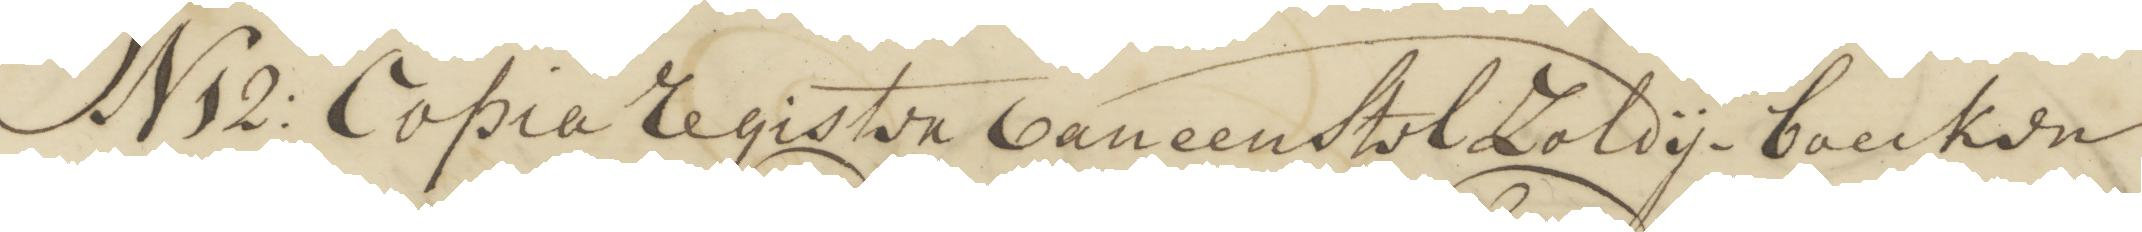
N12: Copia register van een stel zoldij - boecken
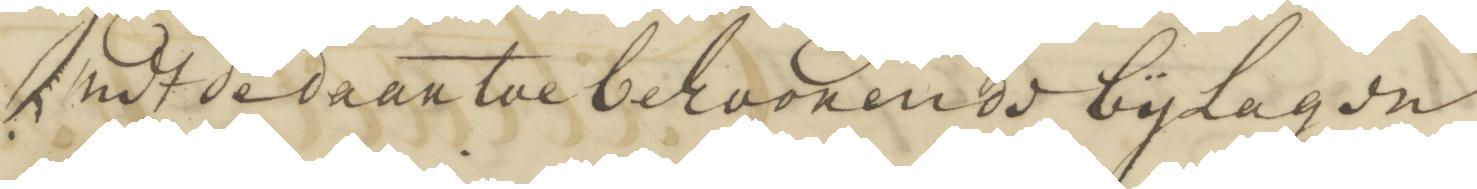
met de daar toe behoorende bijlagen
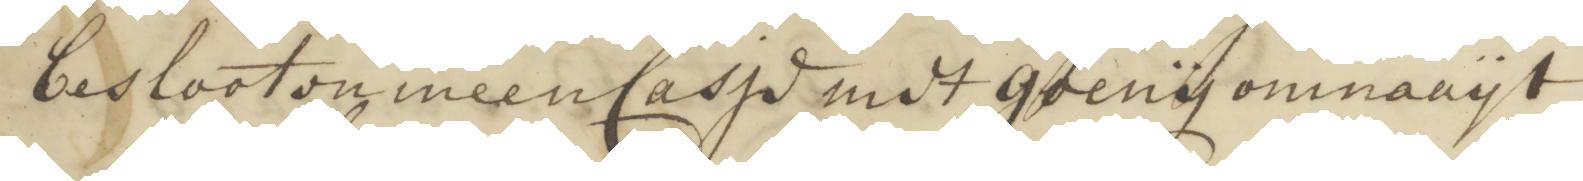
beslooten in een Casje met goenij omnaaijt
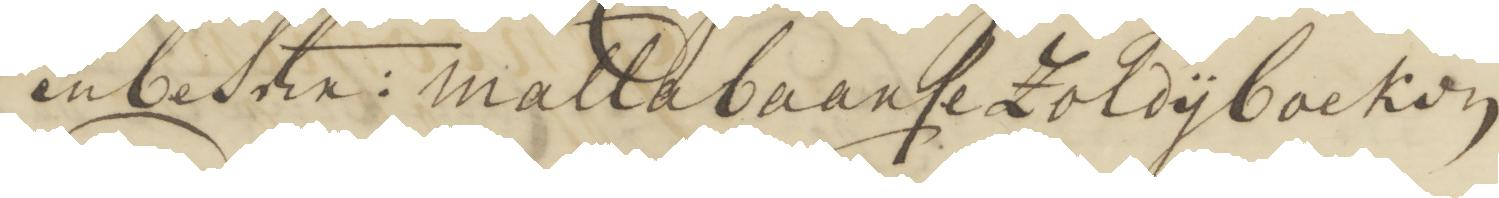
en beschr: mallabaarse zoldijboeken
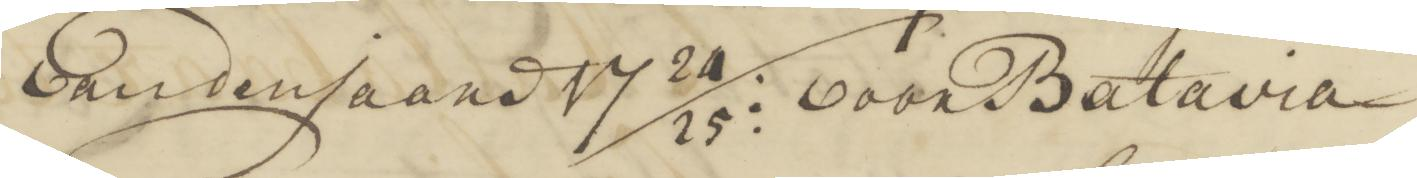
van den jaare 1724/25: voor Batavia
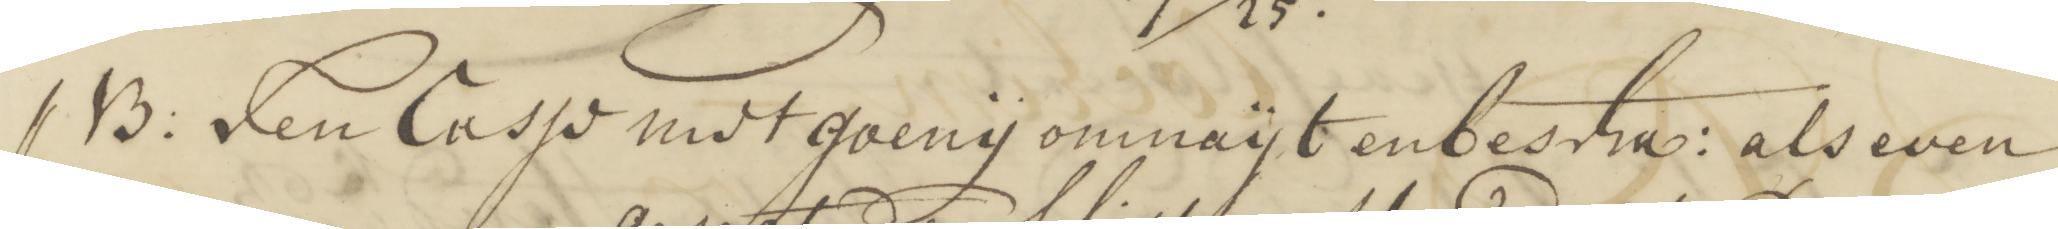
„ 13: Een Casje met goenij omnaijt en beschr: als even
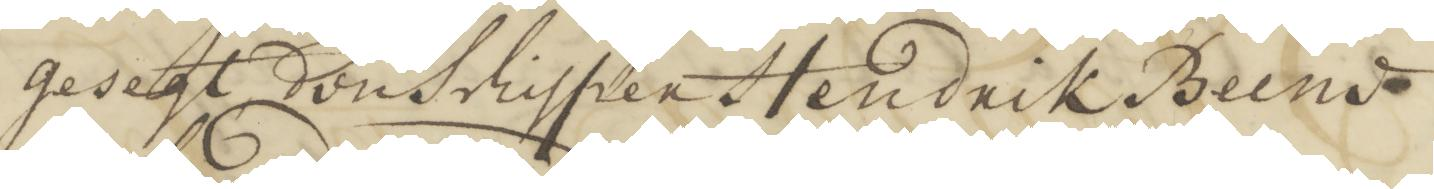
gesegt den schipper Hendrik Beene
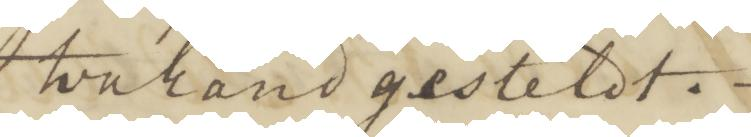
ter hand gesteldt.
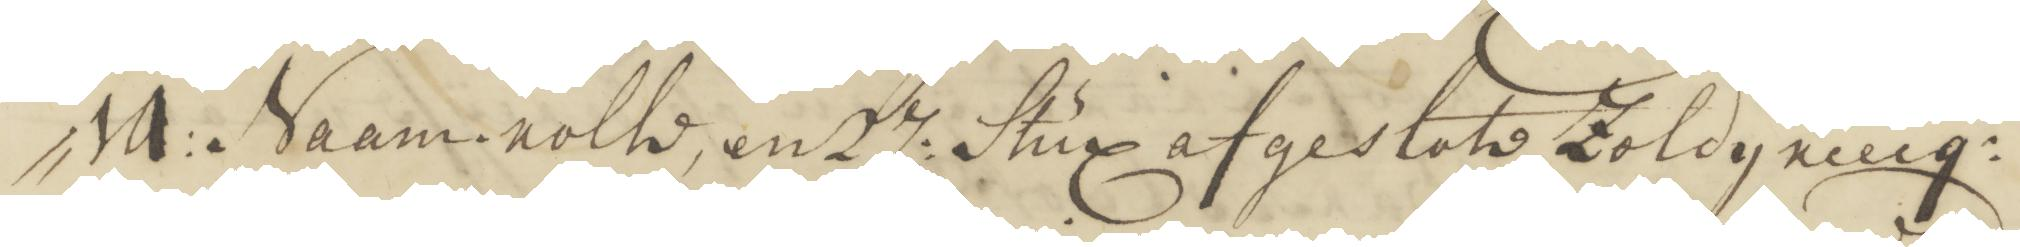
„ 14: Naam rolle, en 27: stux afgeslote zoldy reecq:
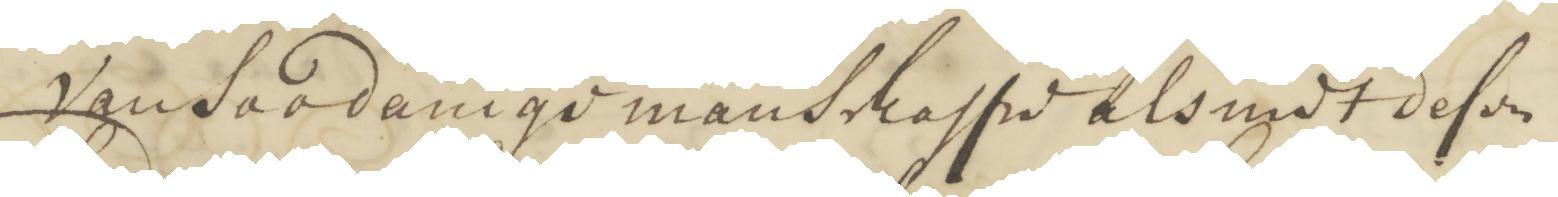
van soodanige manschappe als met desen
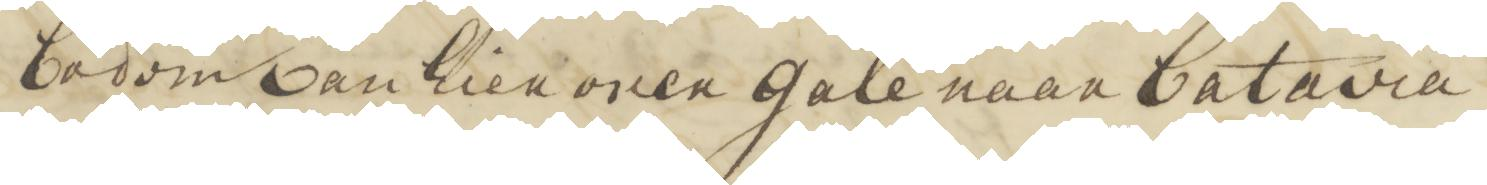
bodem van hier over gale naar batavia
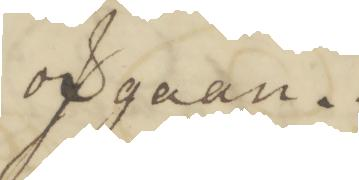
overgaan.
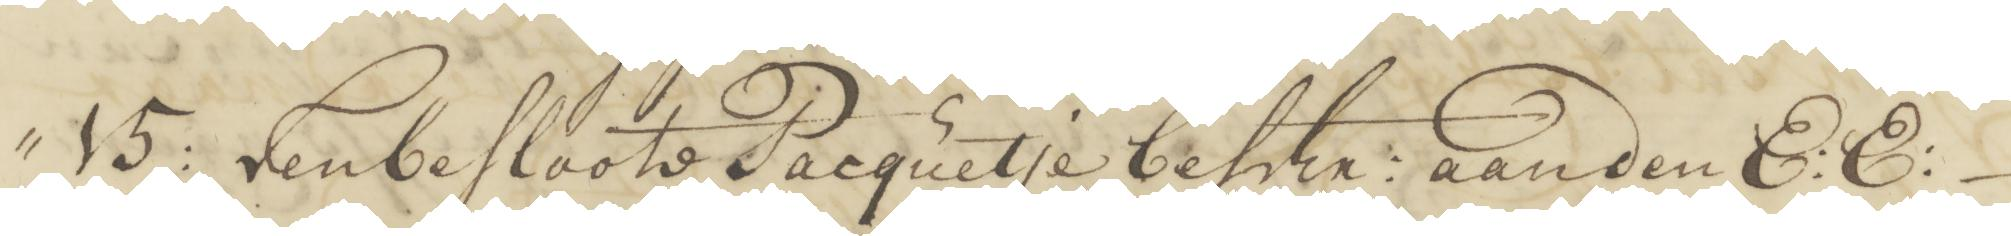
„ 15: Een besloote Pacquetje beschr: aan den E: E: —
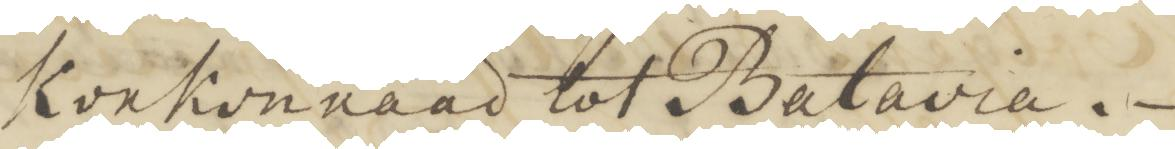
kerkenraad tot Batavia. —
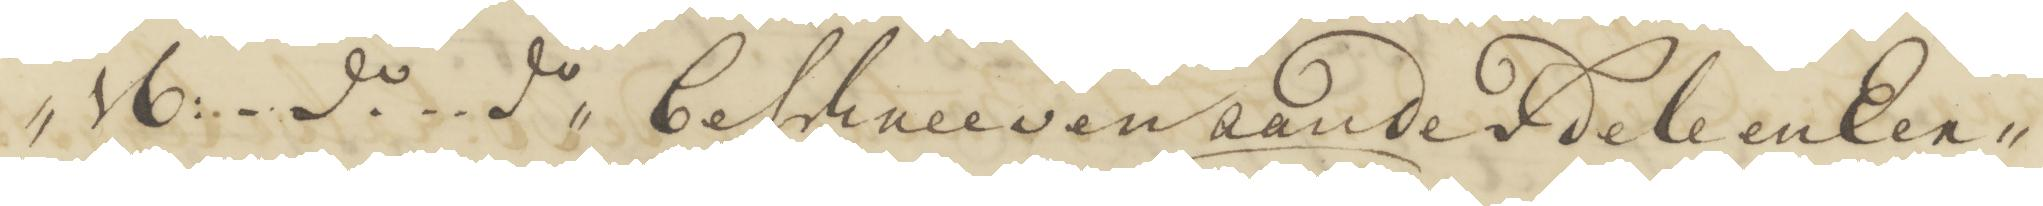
„ 16: – .. d.o - - d„o beschreeven aan de Edele en Eer„
